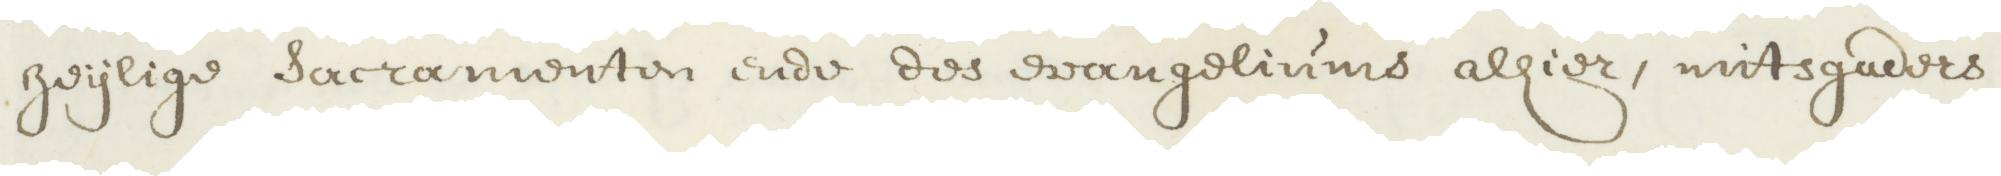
heijlige sacramenten ende des evangeliums alhier, mitsgaders
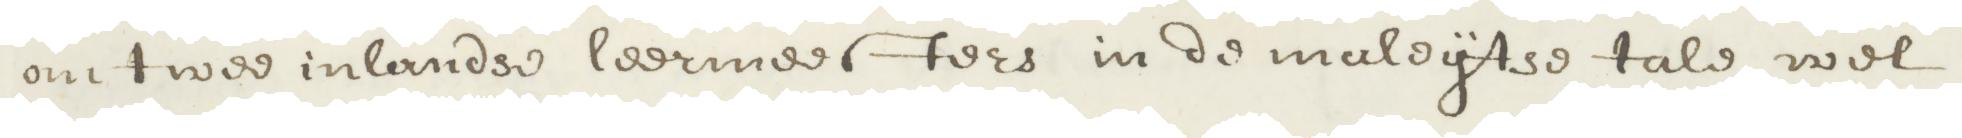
om twee inlandse leermeesters in de maleijtse tale wel
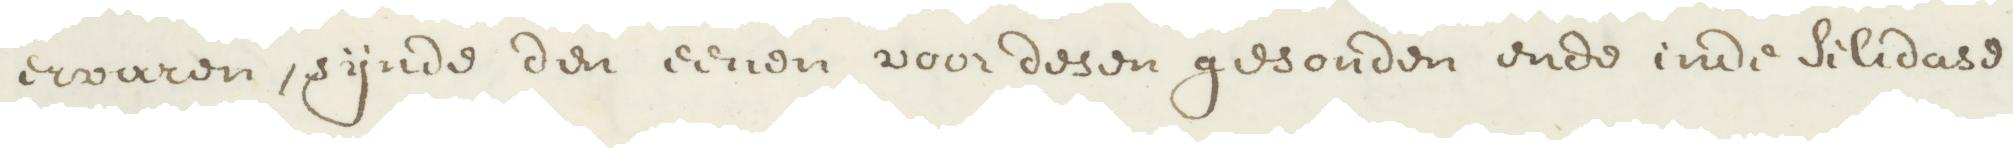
ervaren, sijnde den eenen voor desen gesonden ende inde Silidase
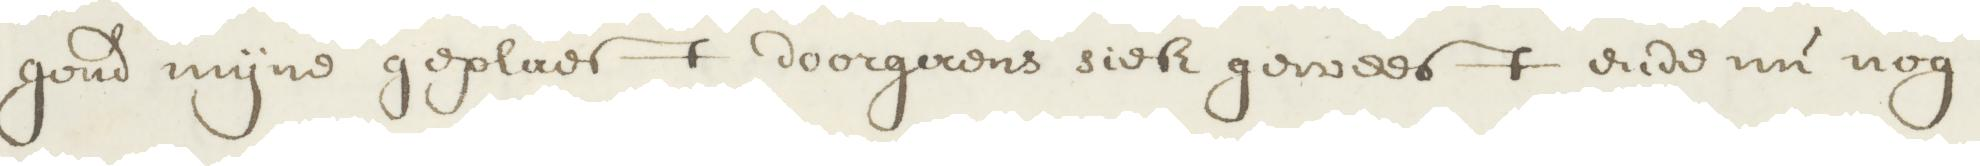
goud mijne geplaest doorgaens siek geweest ende nu nog
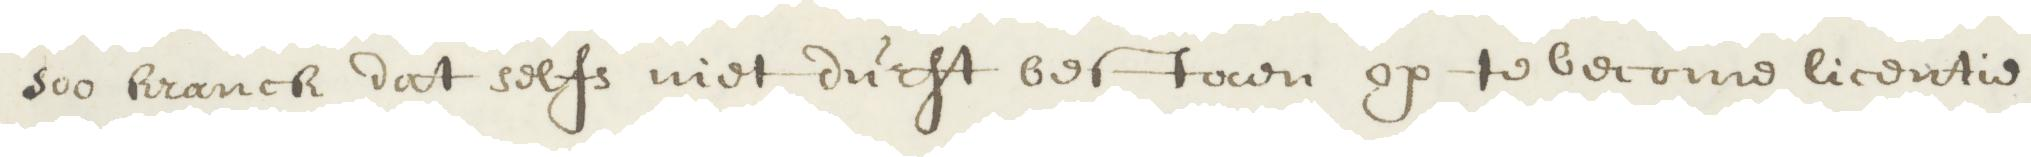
soo kranck dat selfs niet durft bestaen op te become licentie
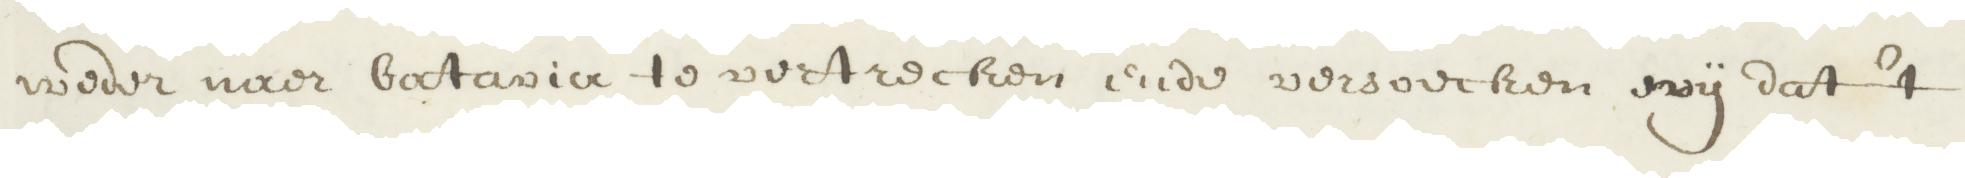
weder naer batavia te vertrecken ende versoecken wij dat ’t
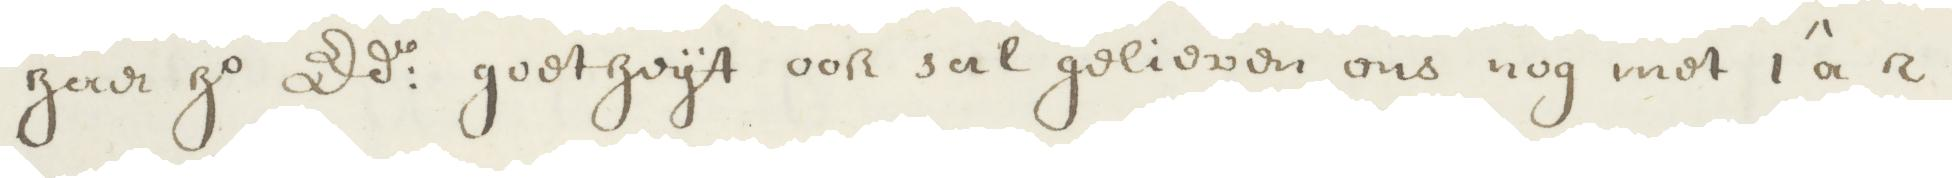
haer ho Ed:e goetheijt ook sal gelieven ons nog met 1 â 2
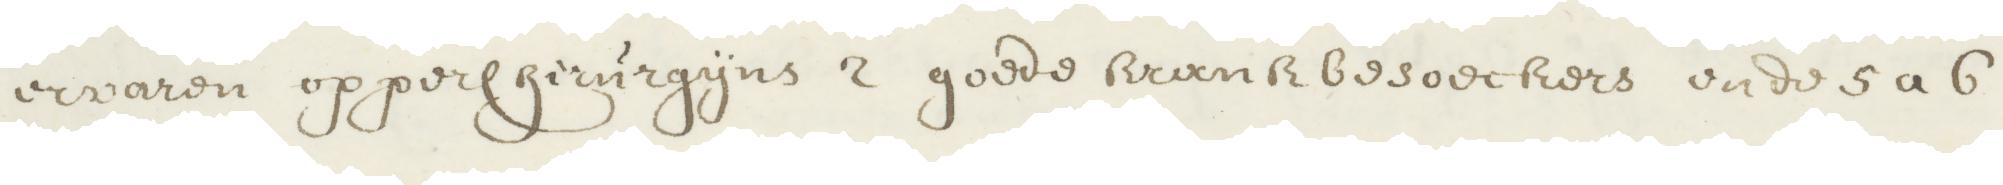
ervaren opperchirurgijns 2 goede krankbesoeckers ende 5 a 6
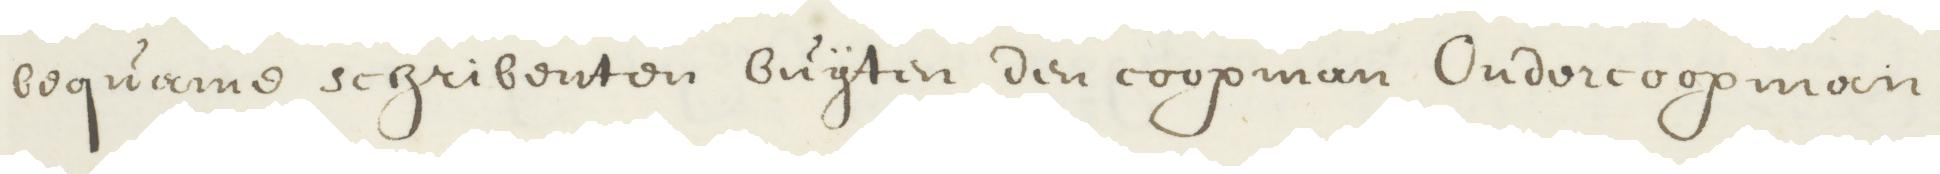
bequame schribenten buijten den coopman Ondercoopman
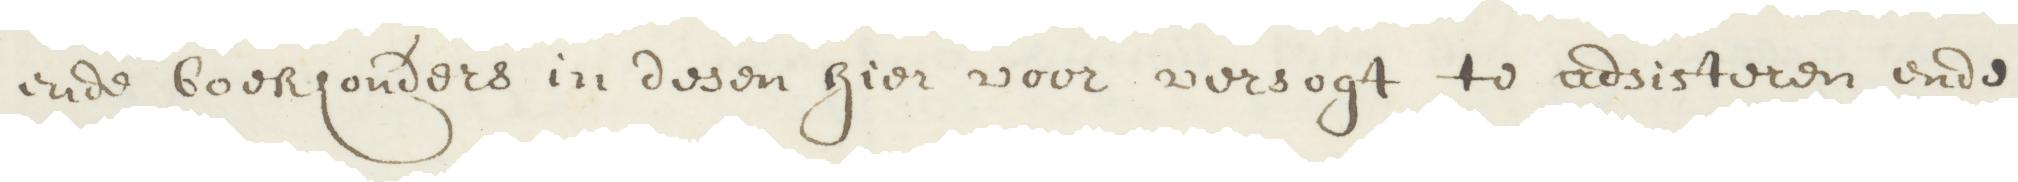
ende boekhouders in desen hier voor versogt te adsisteren ende
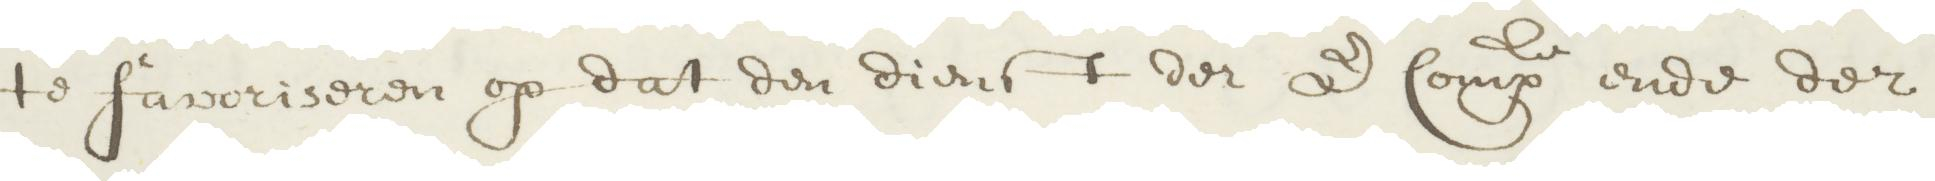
te favoriseren op dat den dienst der E Compe ende der
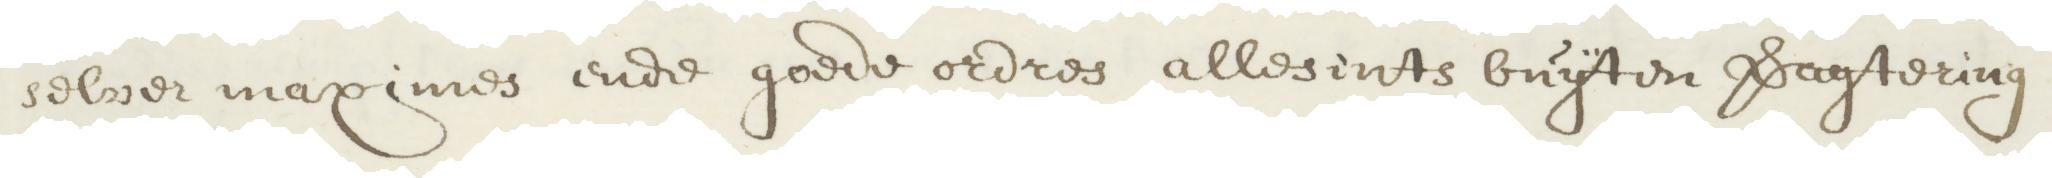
selver maximes ende goede ordres allesints buijten veragtering
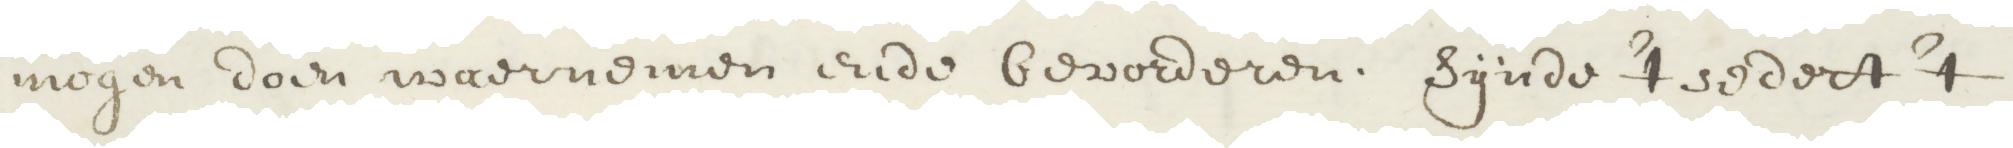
mogen doen waernemen ende bevorderen. sijnde 't sedert ’t
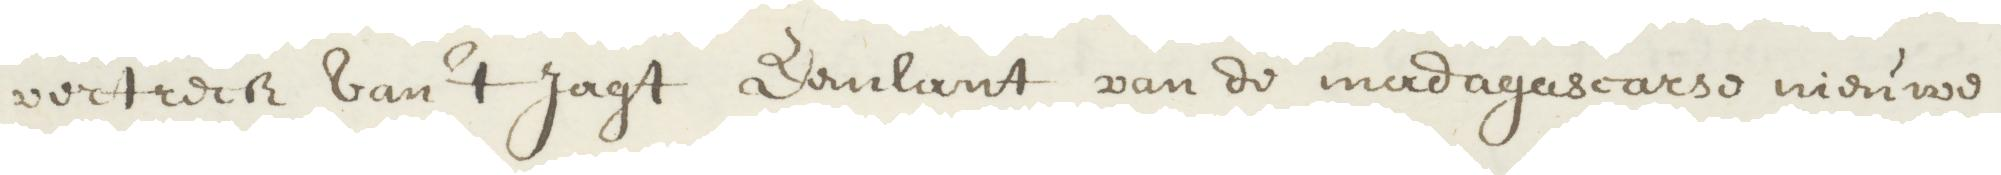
vertreck van 't jagt Eemlant van de madagascarse nieuwe
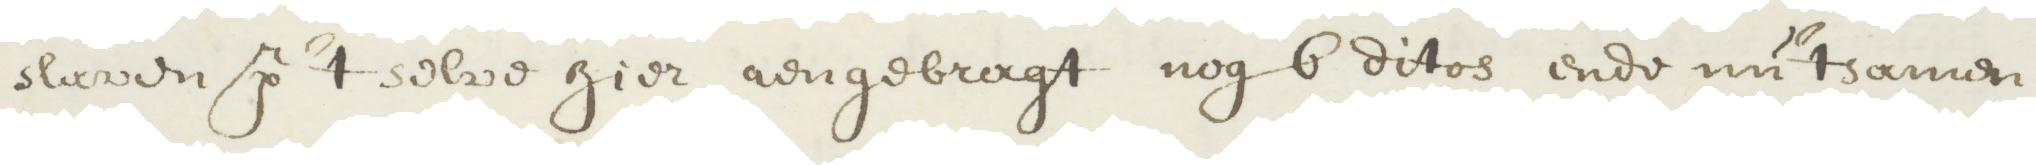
sleven pr ’t selve hier aengebragt nog 6 ditos ende nu 'tsamen
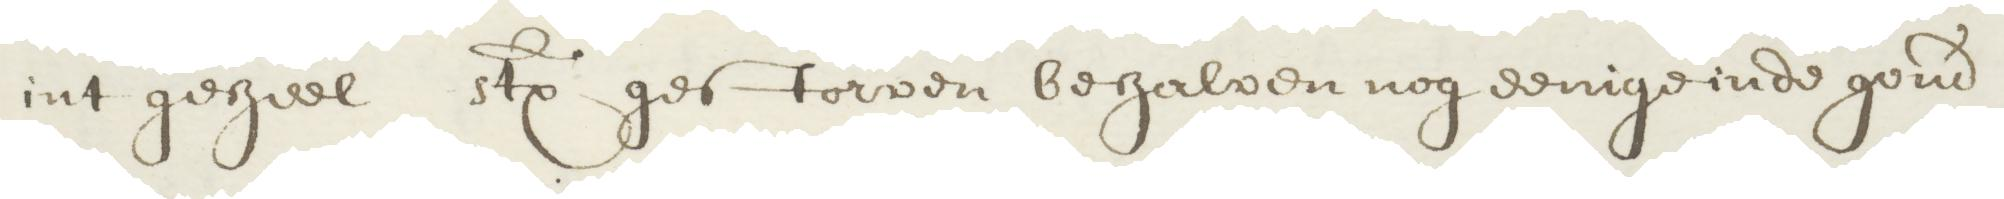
int geheel stx gestorven behalven nog eenige inde goud
